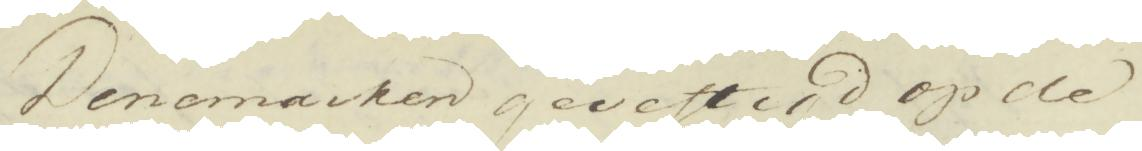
Denemarken gevestigd op de
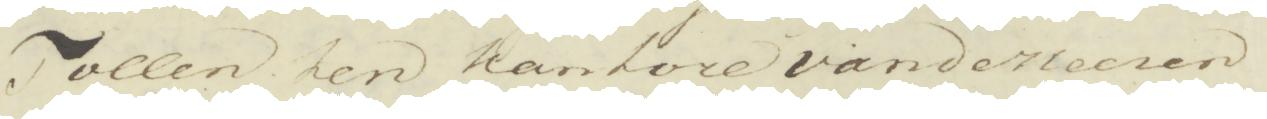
Tollen ten kantore van de Heeren
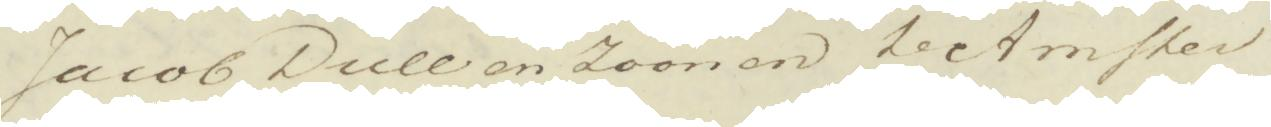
Jacob Dull en zoonen te Amster
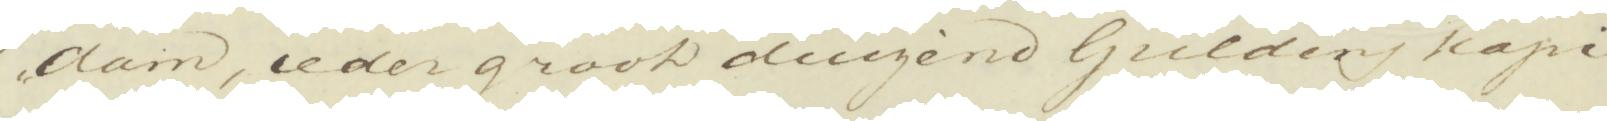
„dam, ieder groot duizend Guldens kapi
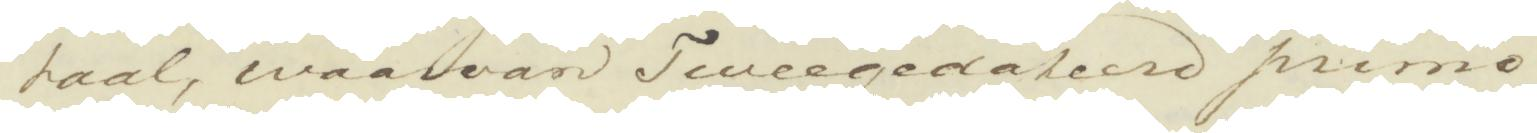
taal, waarvan Twee gedateerd primo
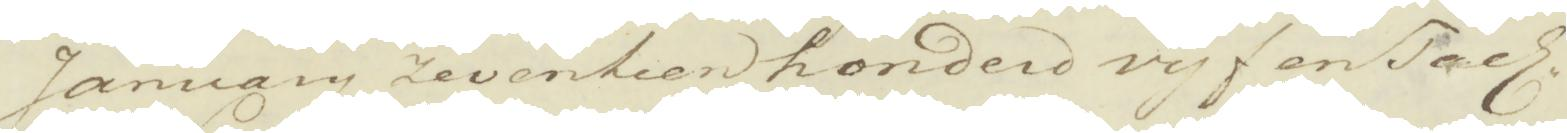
January zeventien honderd vyf en tach„
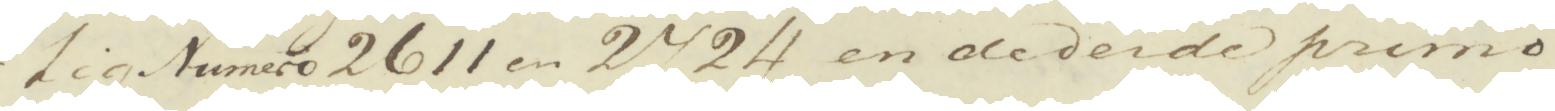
tig Numero 2611 en 2724 en de derde primo
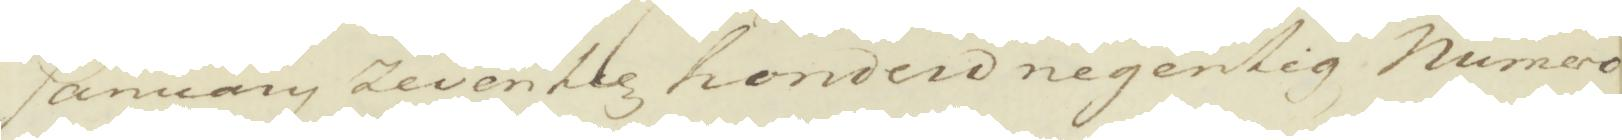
January Zeventien honderd negentig Numero
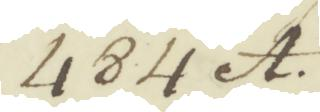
484 A.
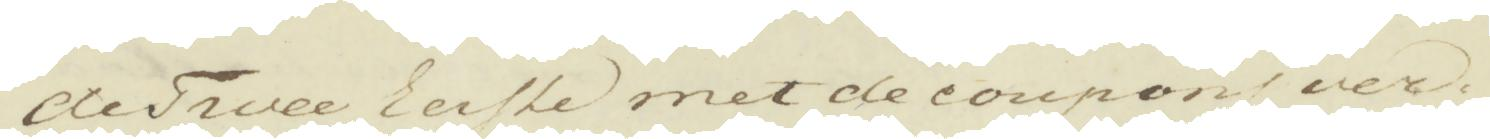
de Twee Eerste met de coupons ver„
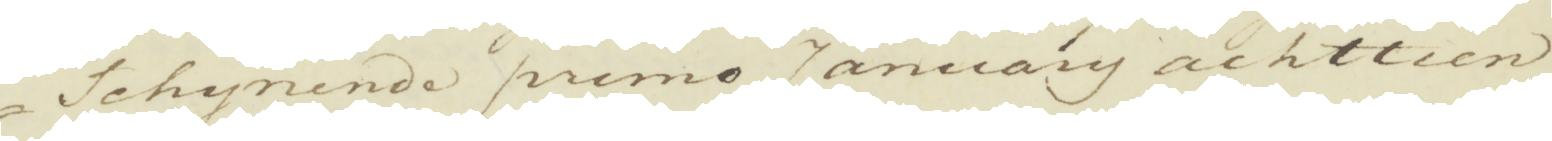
= schynende primo January achttien
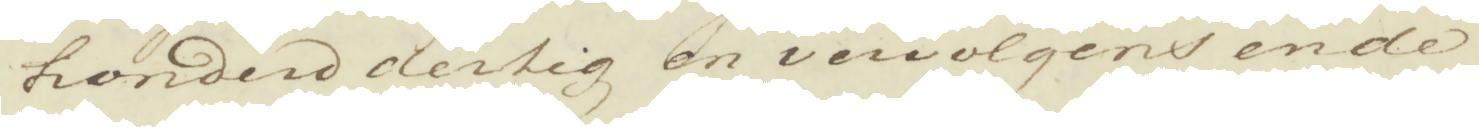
honderd dertig en vervolgens en de
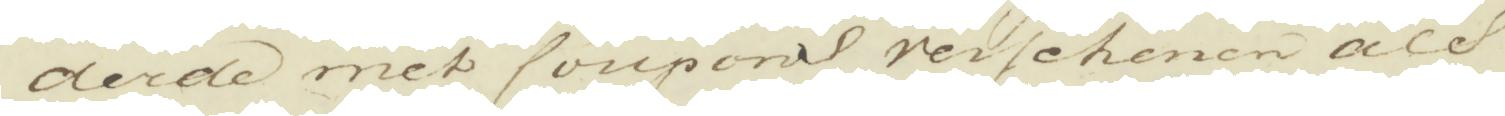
derde met Coupons verschenen als
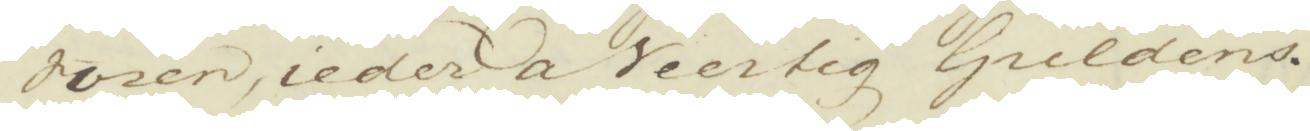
voren, ieder a Veertig Guldens.
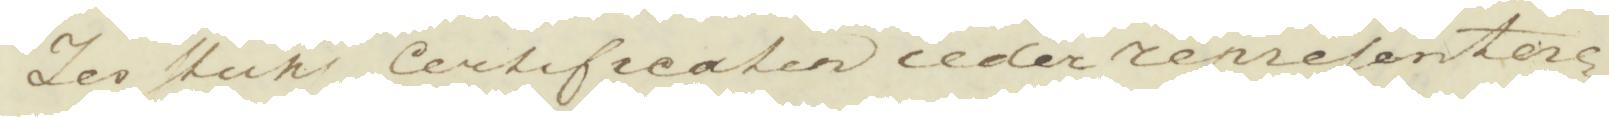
Zes stuks certificaten ieder representeren
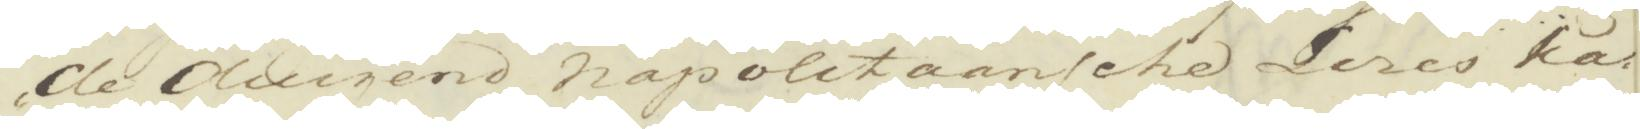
„de duizend napolitaansche Lires ka„
